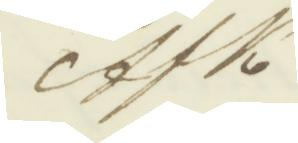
Afk
